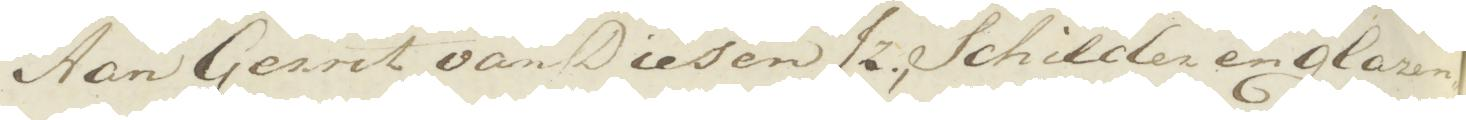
Aan Gerrit van Diesen Jz., schilder en glazen„
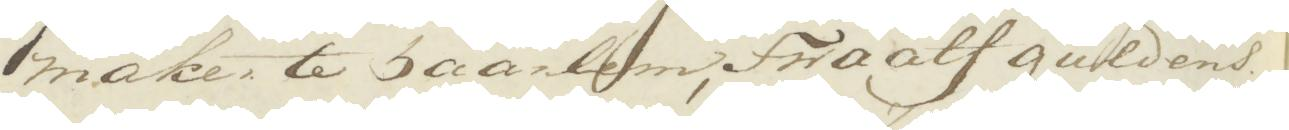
maker te haarlem, Twaalf guldens.-
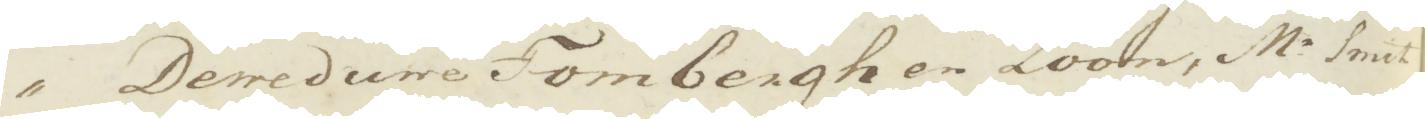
„ De weduwe Tombergh en Zoon, Mr Smit
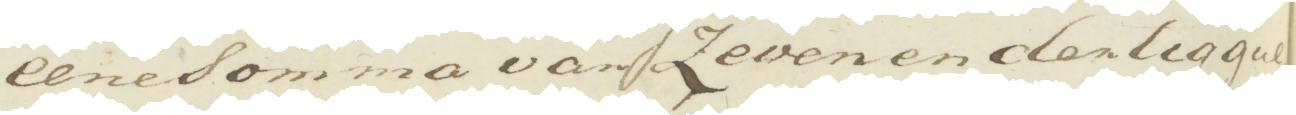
eene somma van Zeven en dertig gul
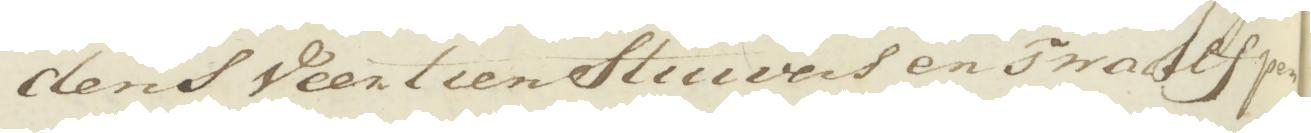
dens Veertien stuivers en 5 Twaalf pen
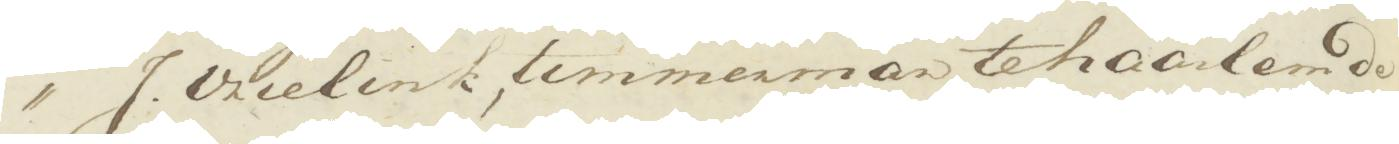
„ J. Vrielink, timmerman, te haarlem de
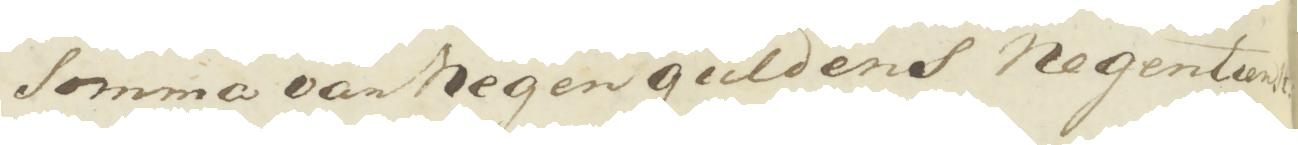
somma van Negen guldens Negentien
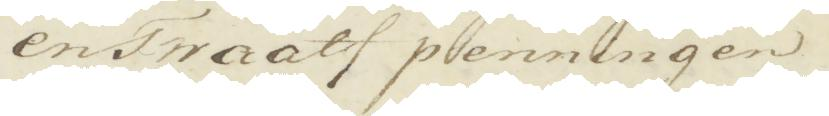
en Twaalf penningen
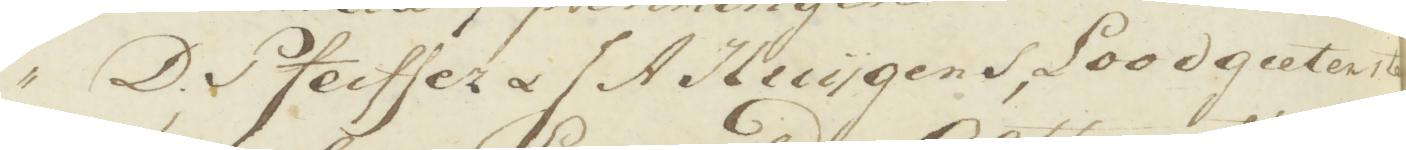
„ D. Pfeiffer & J A Huijgens, Loodgieters te
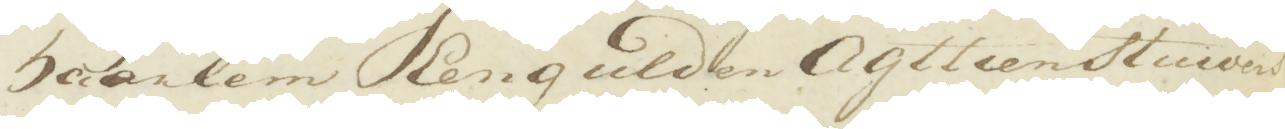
Haarlem, Een gulden Agttien stuivers
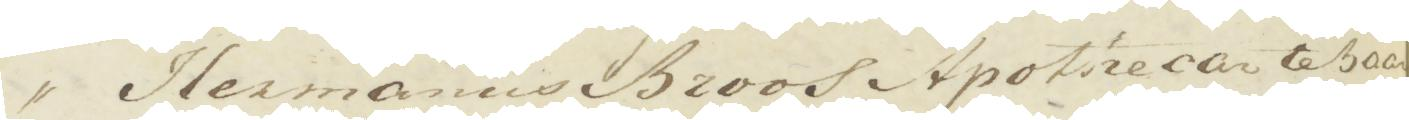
„ Hermanus Broos Apothecar te haar
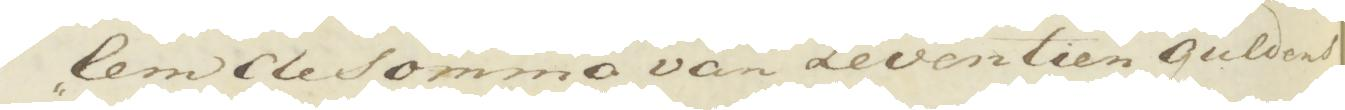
„lem de somma van Zeventien guldens
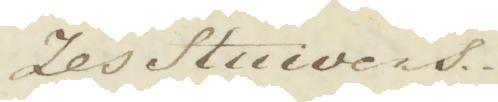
zes stuivers. -
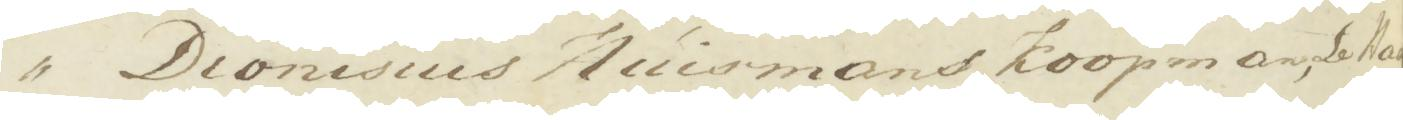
„ Dionisius Huismans, koopman, te Ha
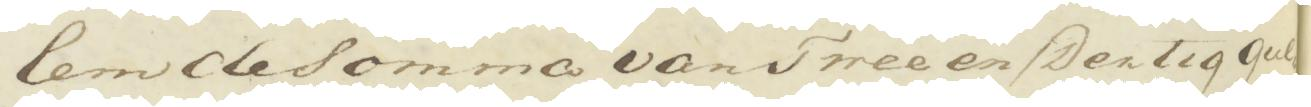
lem de somma van Twee en Dertig gul
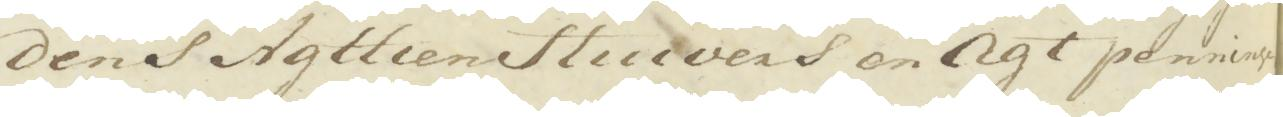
dens Agttien stuivers en Agt penningen
